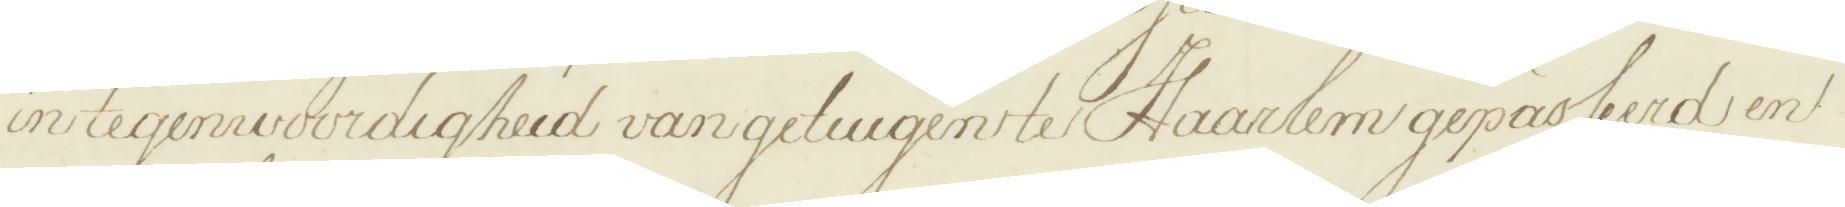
in tegenwoordigheid van getuigen te Haarlem gepasseerd en
